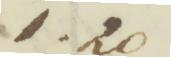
1.20
